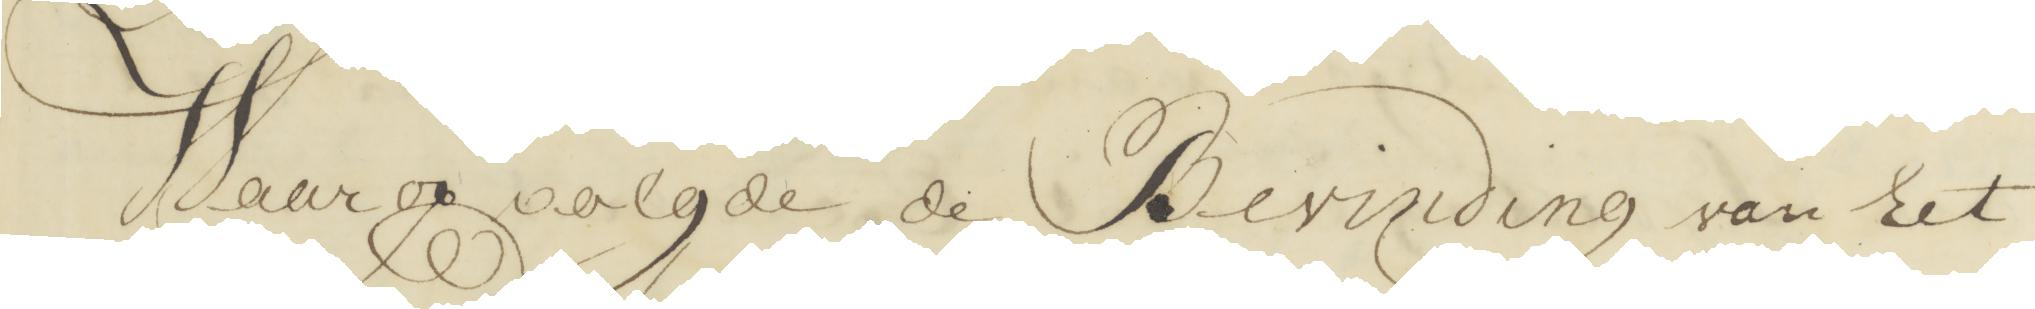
Waar op volgde de Bevinding van het
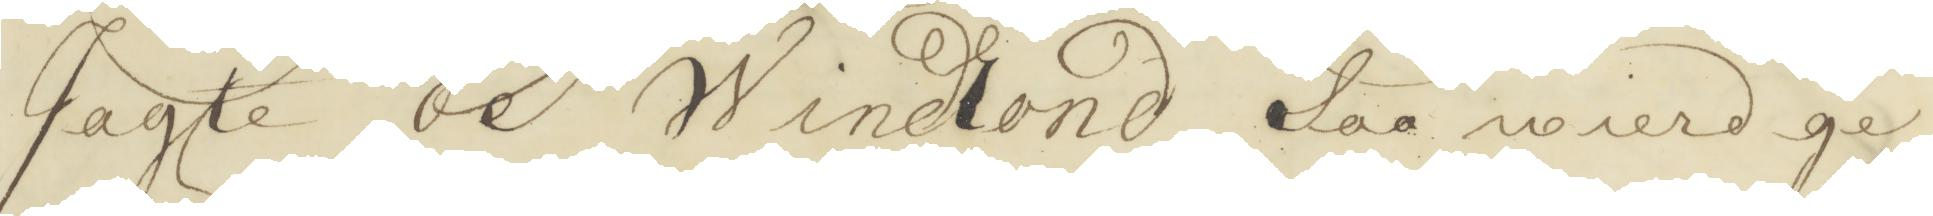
Jagte de Windhond, soo wierd ge
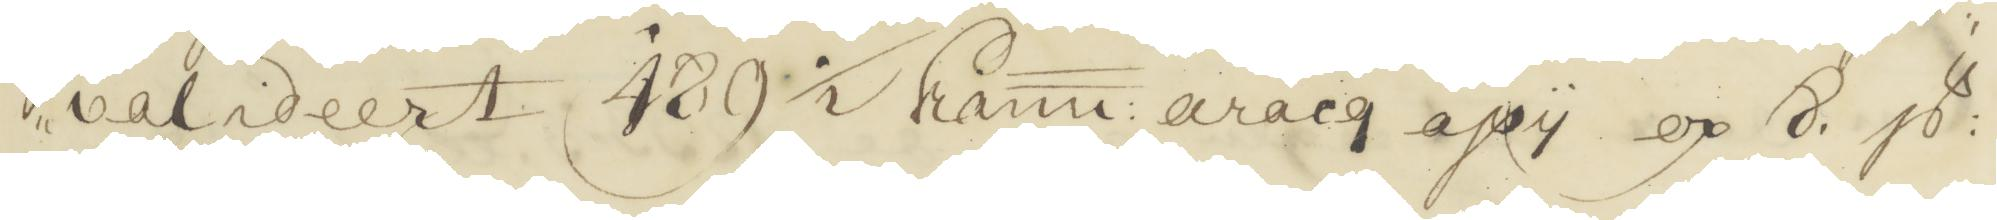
„valideert 189½ kann: aracq apij op 8. p:s
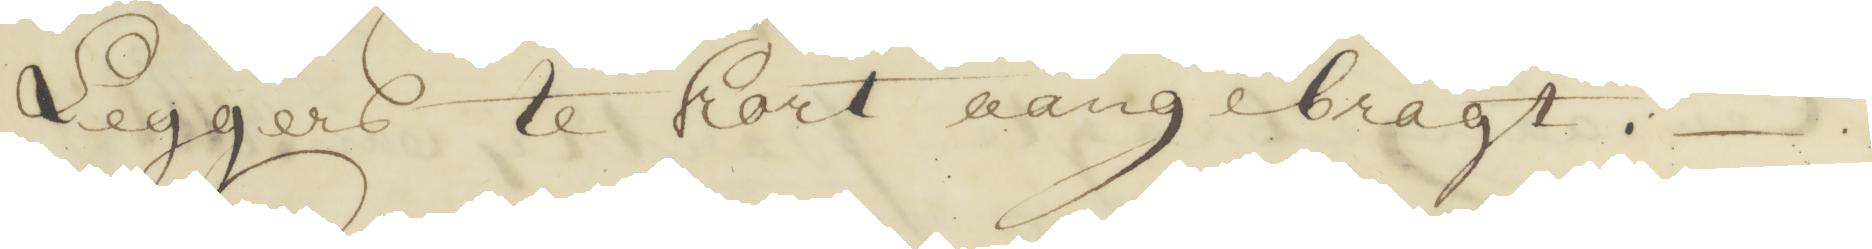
Leggers te kort aangebragt. —.
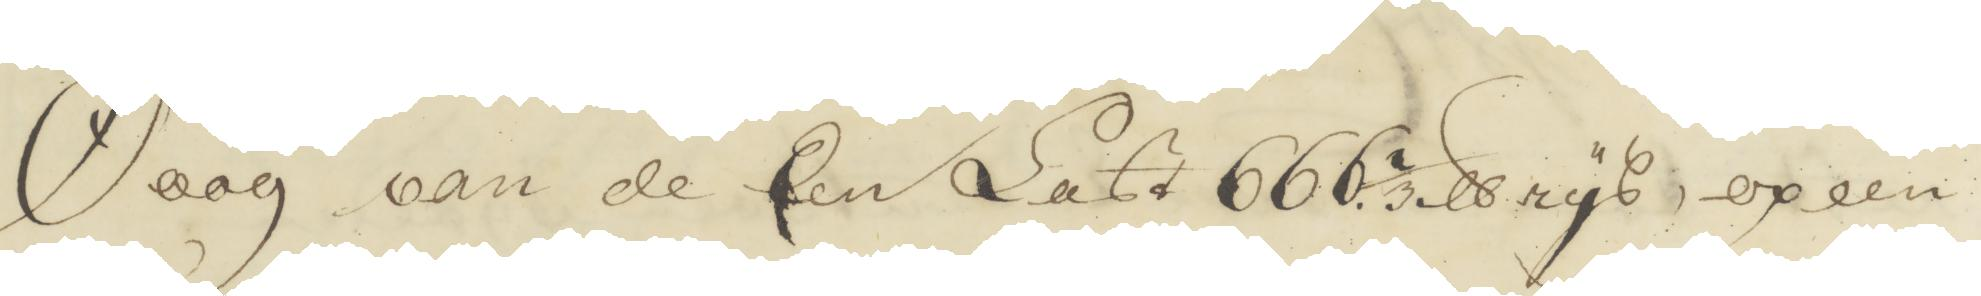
Hoog van de Een Last 666. 2/3 lb rijs, op een
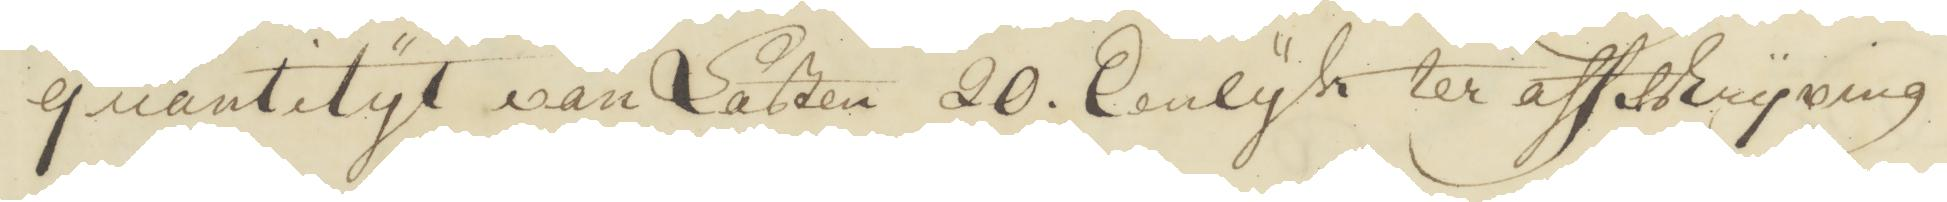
quantitijt van Lasten 20. Eenlijk ter affschrijving
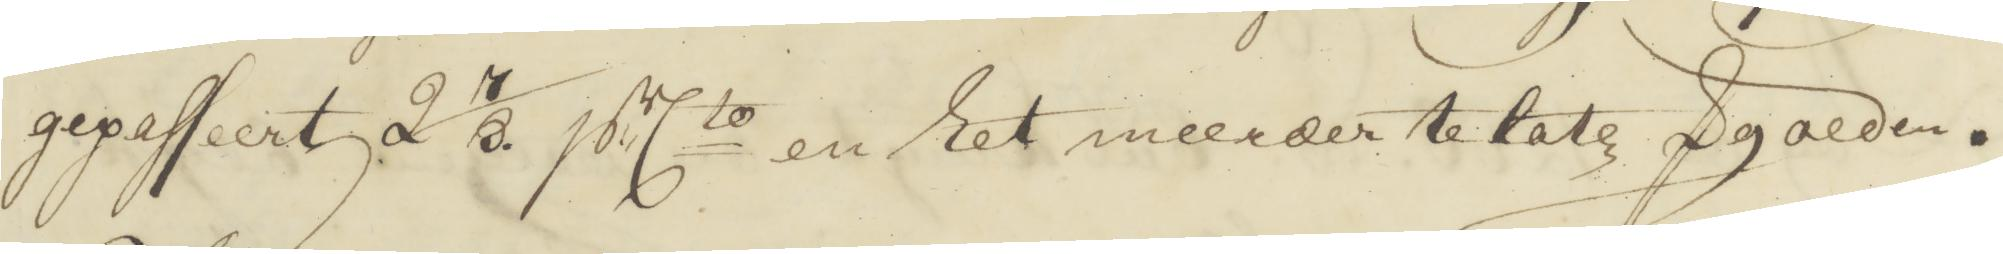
gepasseert 2 7/8. p„r C=to en het meerder te laten vergoeden.
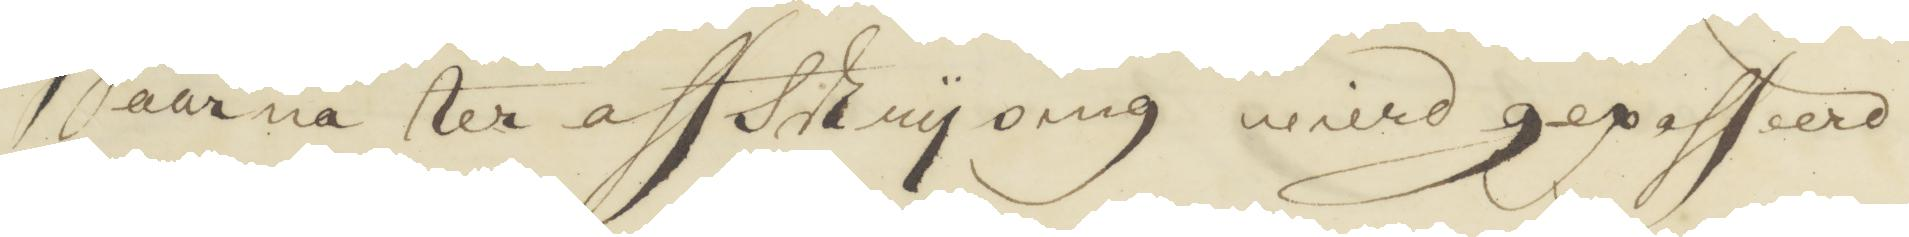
Waar na ter affschrijving wierd gepasseerd
